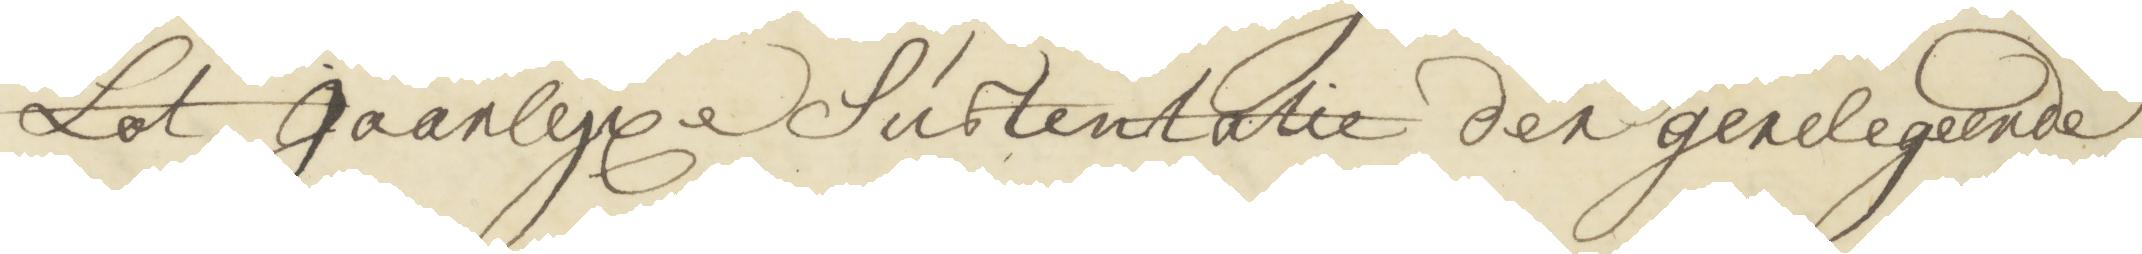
tot jaarlijxe sustentatie der gerelegeerde
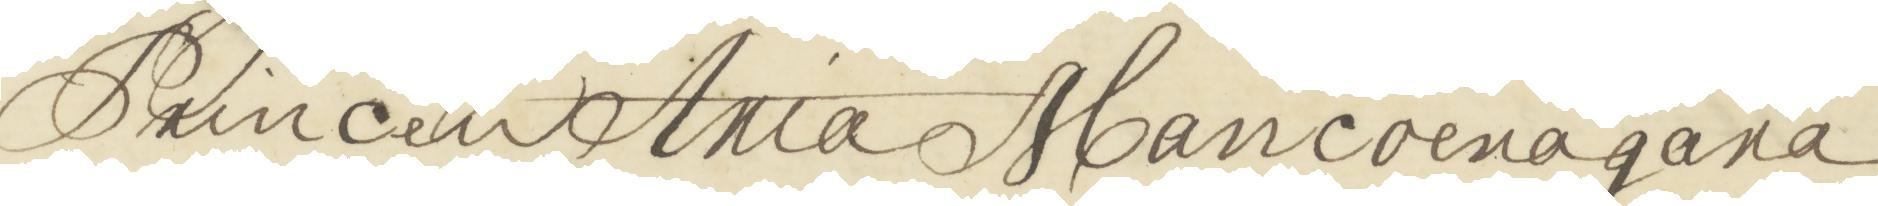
Princen Aria Hancoenagara
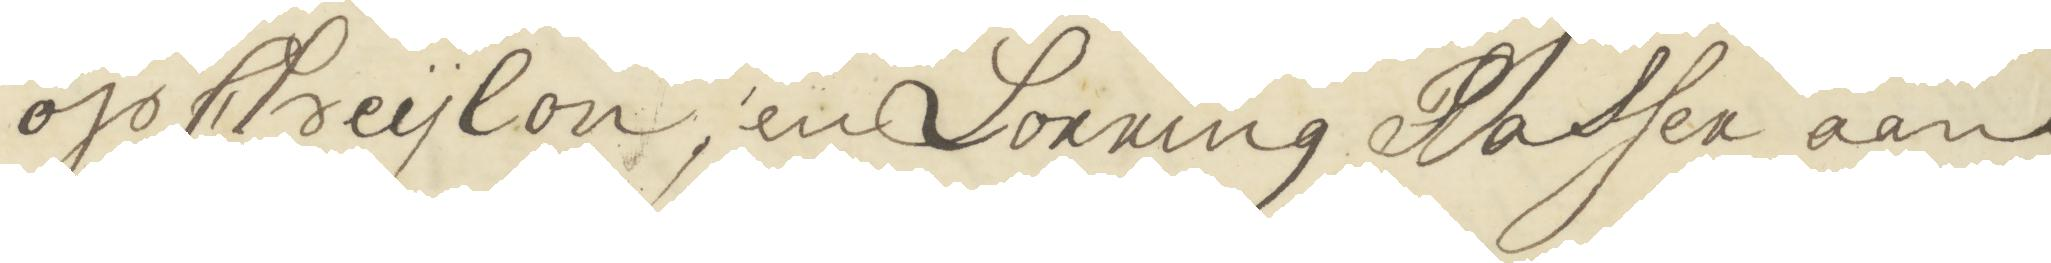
op Cheijlon, en Lorring Passer aan
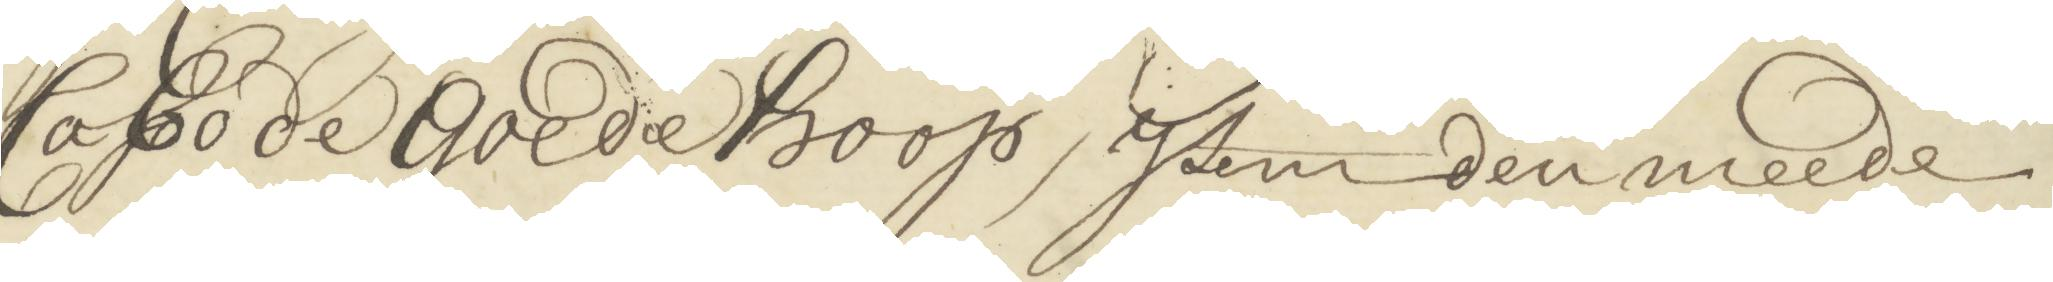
Cabo de goede Hoop, jtem den meede
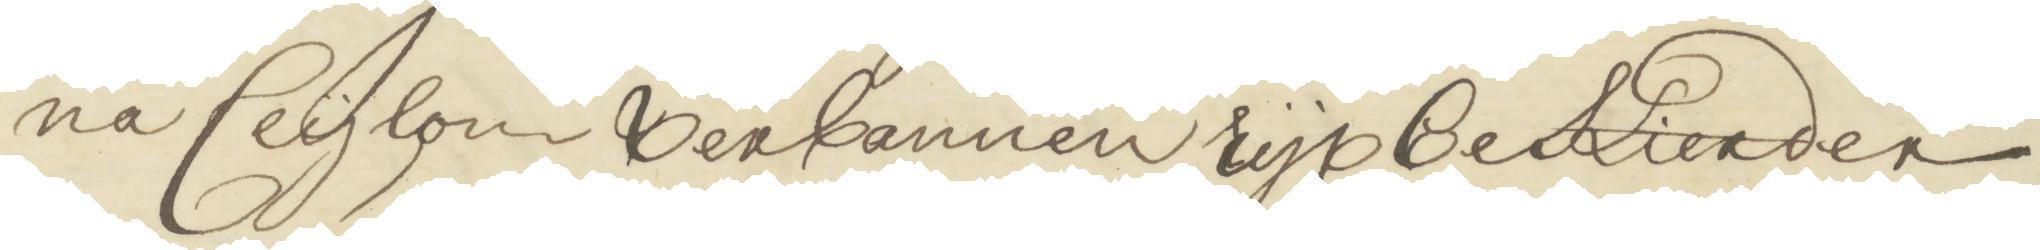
na Ceijlon verbannen rijx bestierder
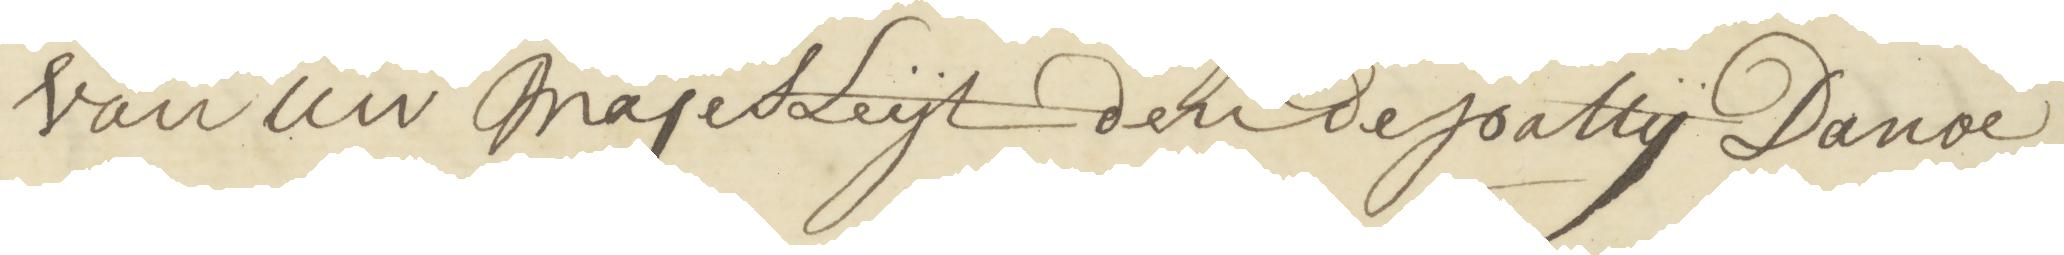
van uw majesteijt den depattij Danoe
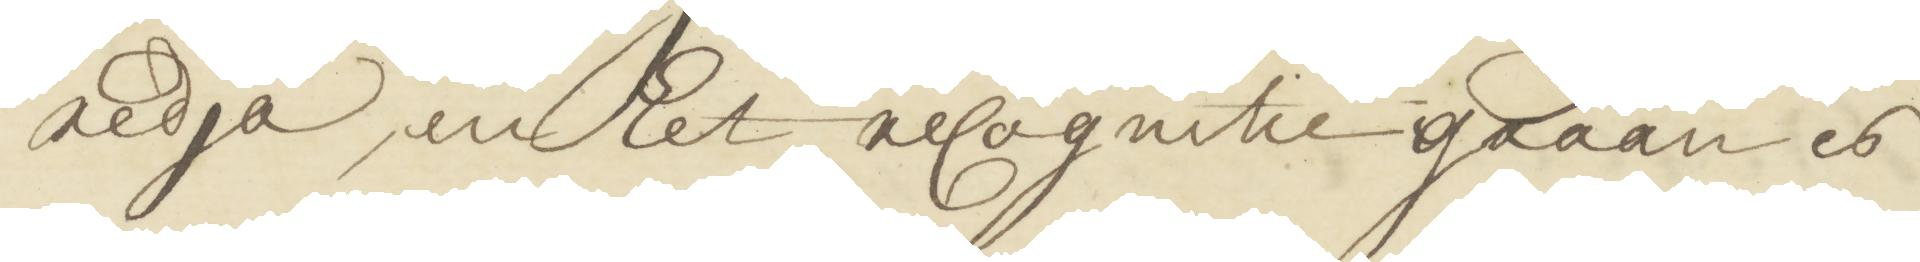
redja, en het recognitie graan is
